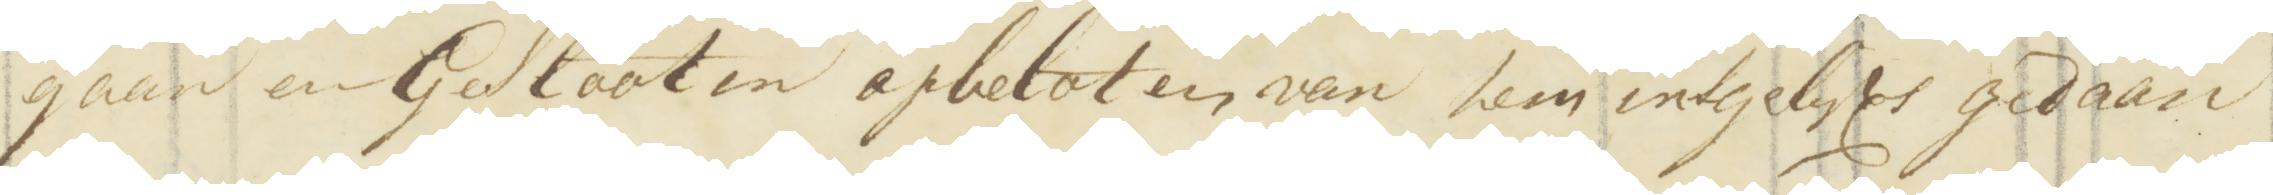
gaan en Geslooten opbeloten van hem ingelyks gedaan
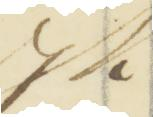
Jk
